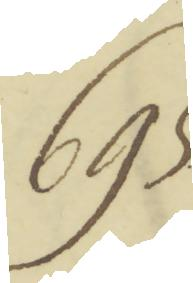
695
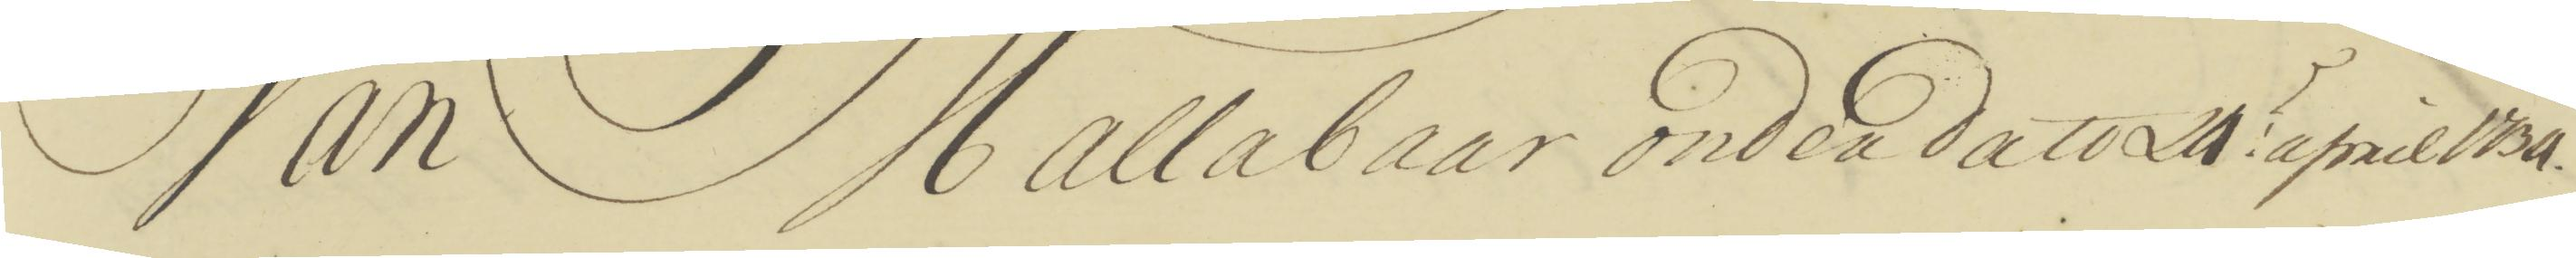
Van Mallabaar onder dato 24:' april 1734.
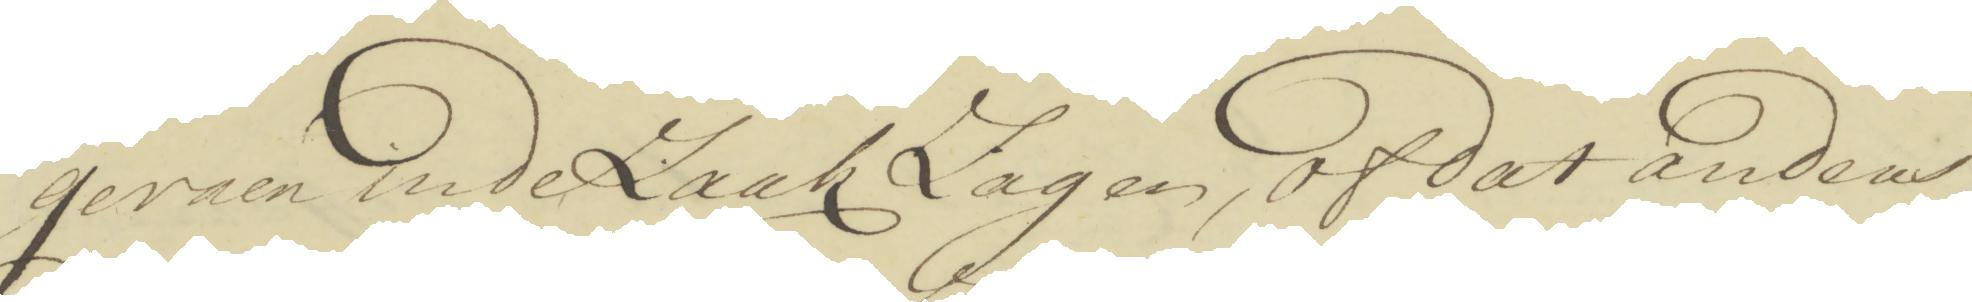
gevaer in de zaak zagen, of dat anders
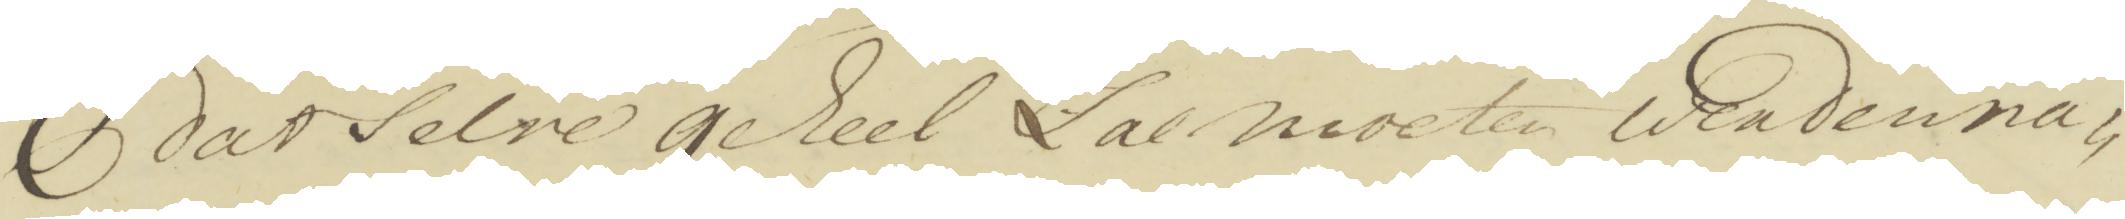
datselve geheel zal moeten werden na„
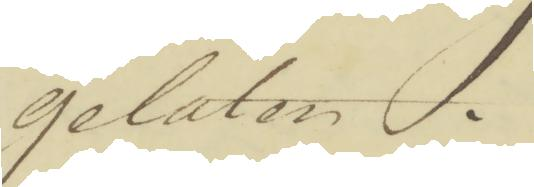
gelaten.
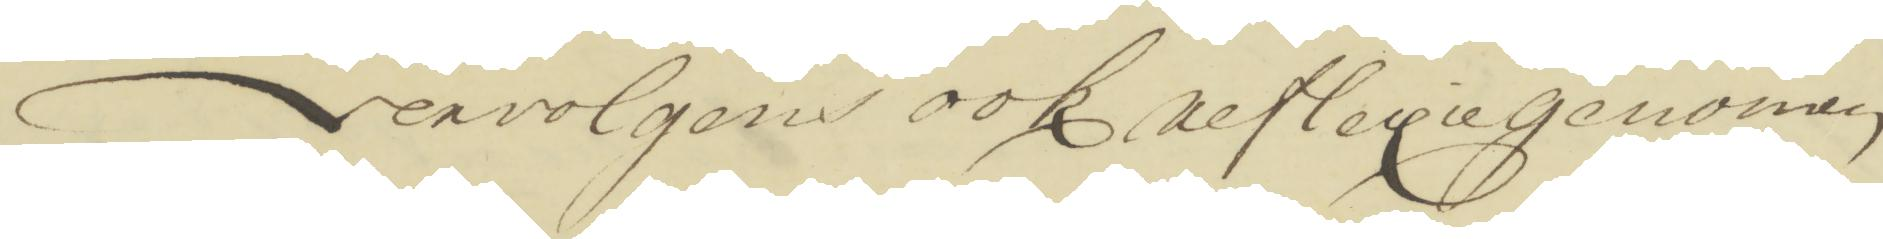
vervolgens ook reflexie genomen
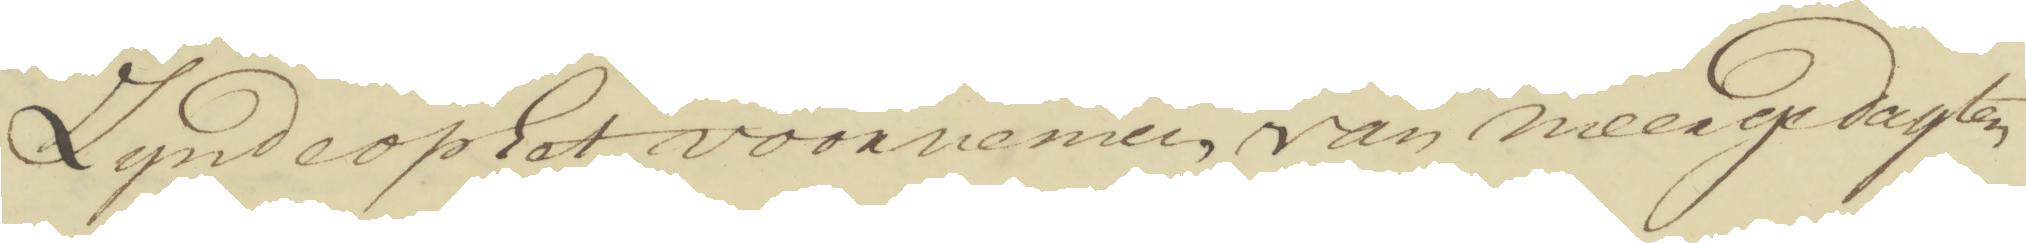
zynde op het voornemen van meer gedagten
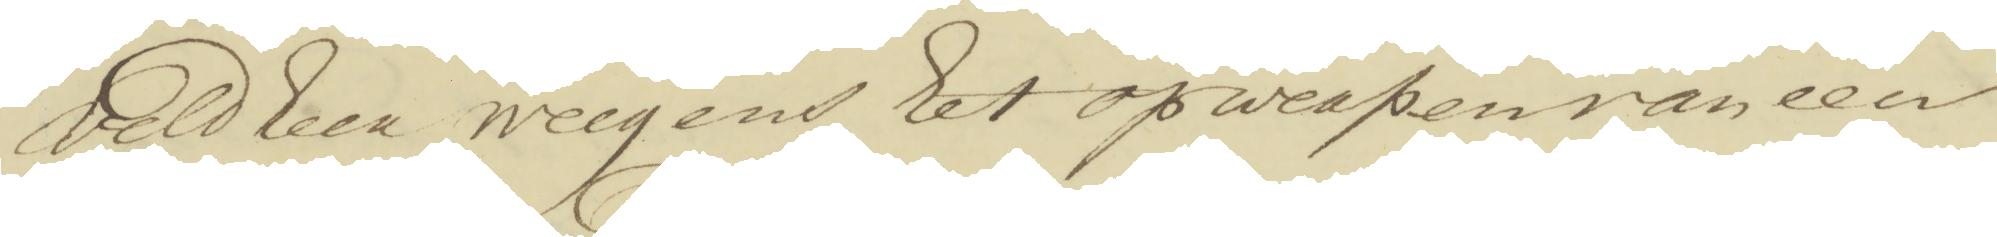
veld heer weegens het opwerpen van een
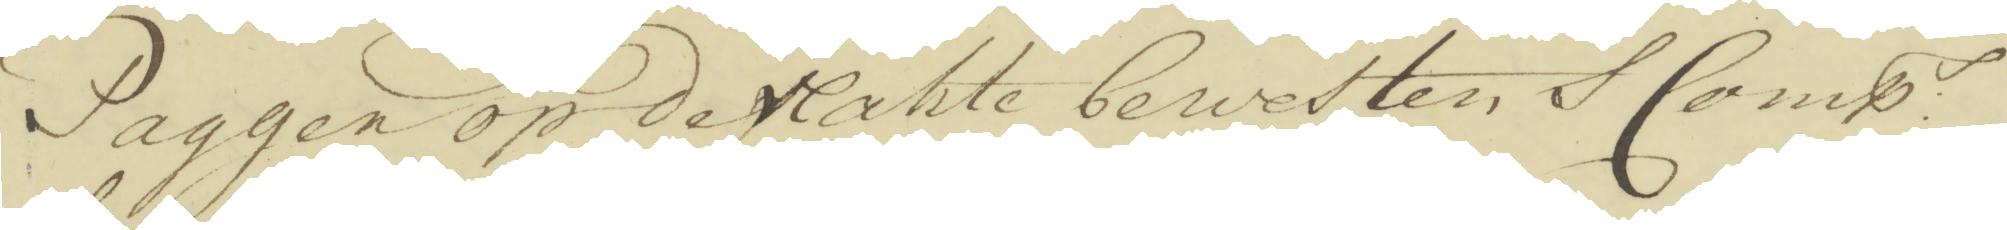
Pagger op de vlakte bewesten ’s Comp:s
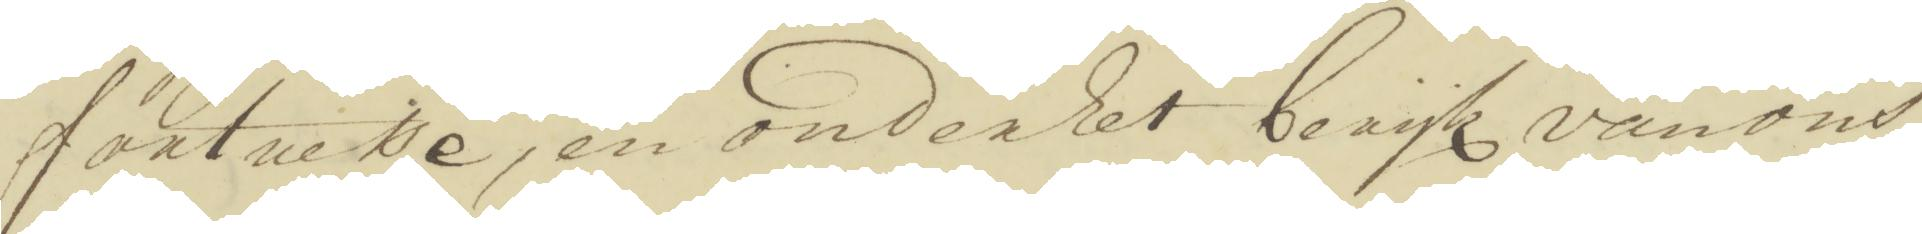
fortresse, en onder het berijk van ons
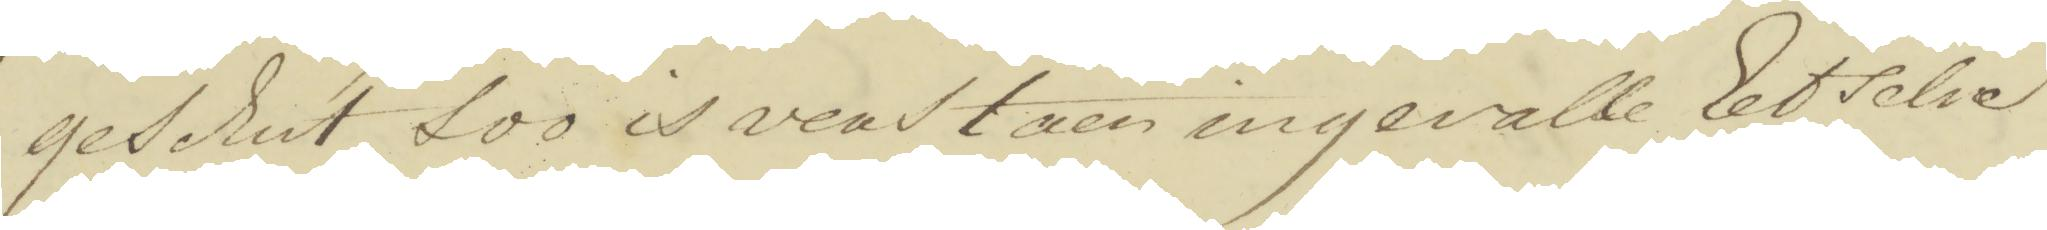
geschut soo is verstaen ingevalle het selve
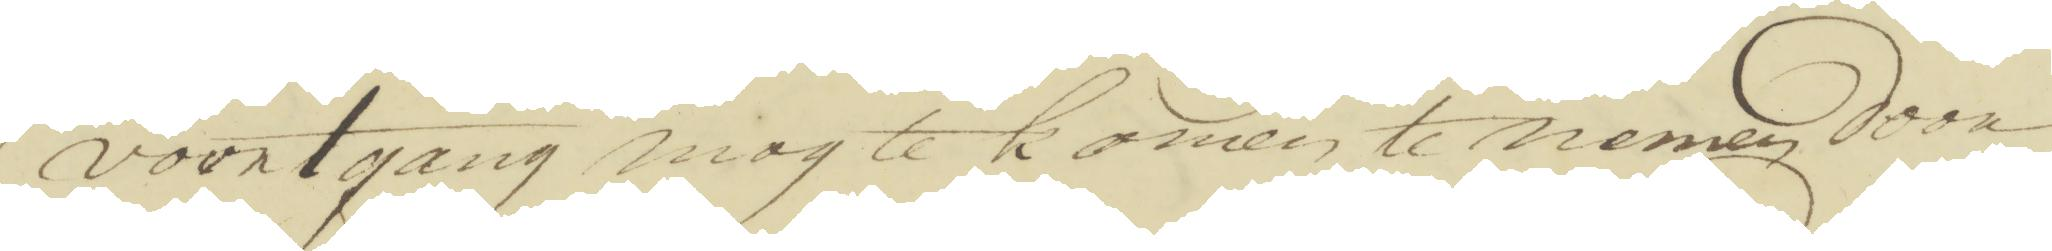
voortgang mogte komen te nemen door
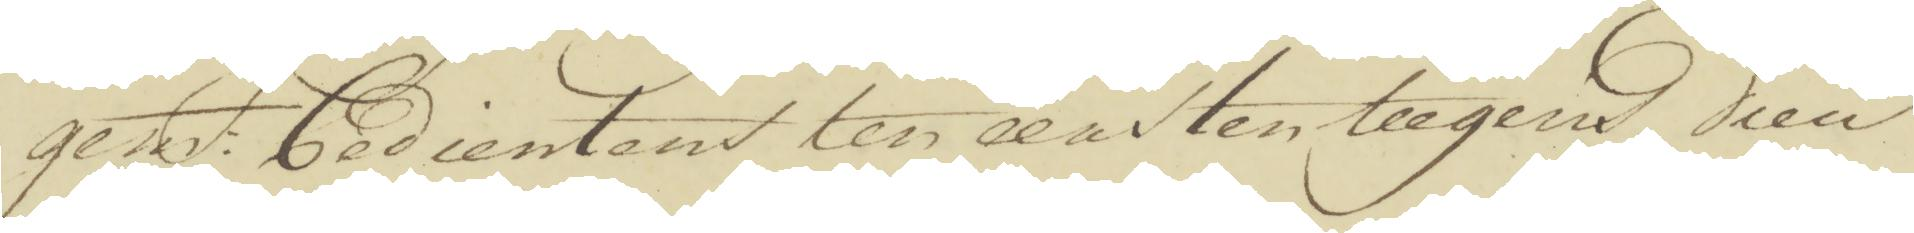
gem: bedientens ten eersten teegens dien
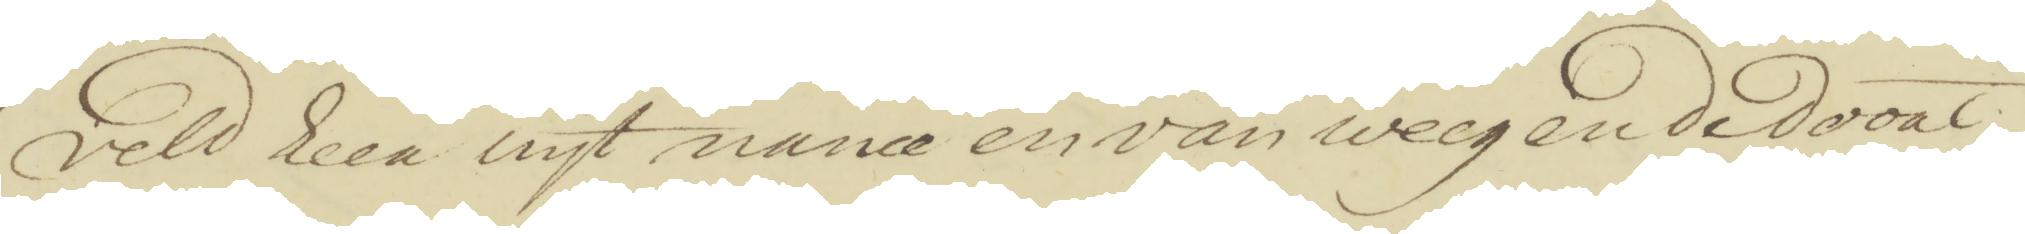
veld heer uyt name en van weegen de doorl:
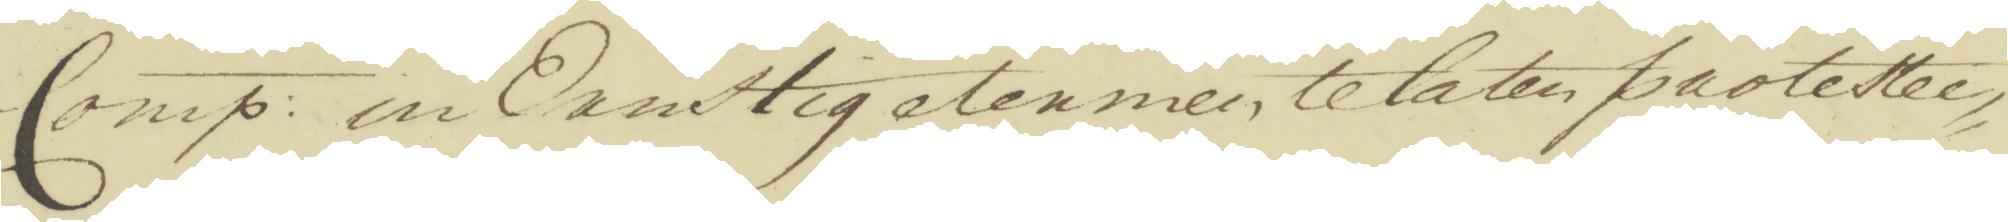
Comp: en Ernstigetermen te laten protestee„
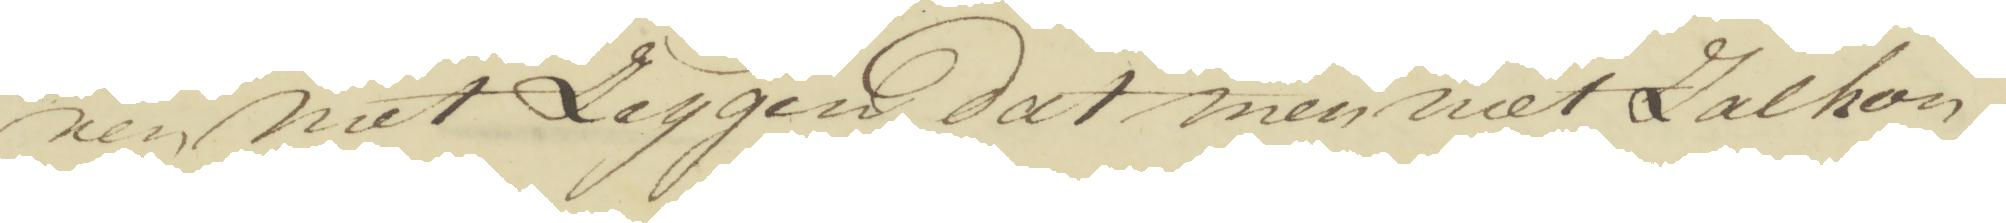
ren met zeggen dat men niet zal kon
